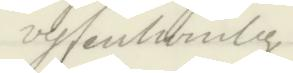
vyfentwintig
